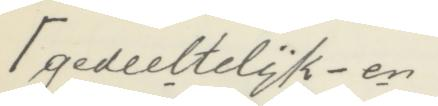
¶gedeeltelijk - en
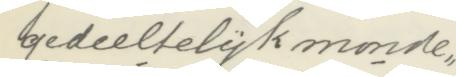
gedeeltelijk monde„
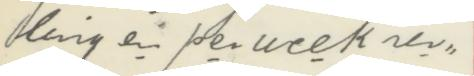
ling en per welk ver„
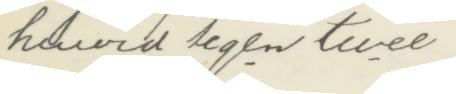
huurd tegen twee
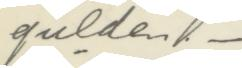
gulden.—
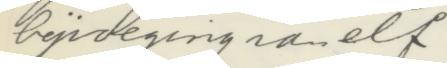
bijvoeging van elf
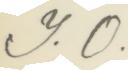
J. O.
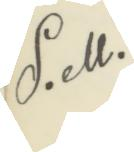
S. ell.
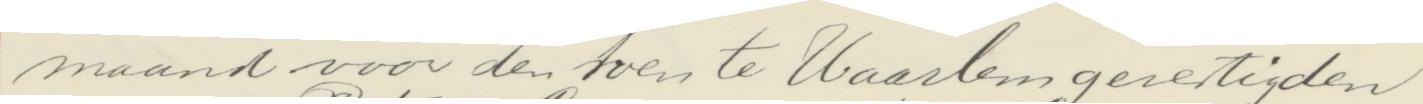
maand voor den toen te Haarlem gevestigden
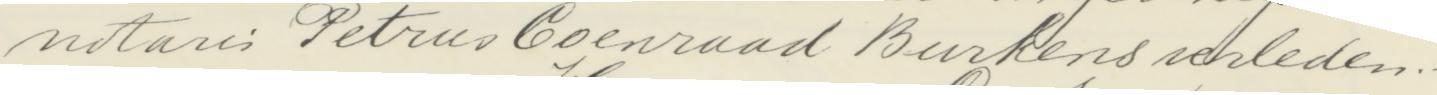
notaris Petrus Coenraad Burkens verleden.
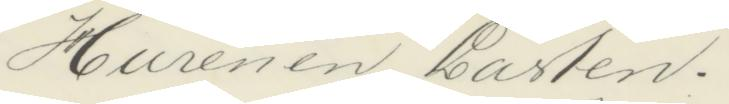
Huren en Lasten.
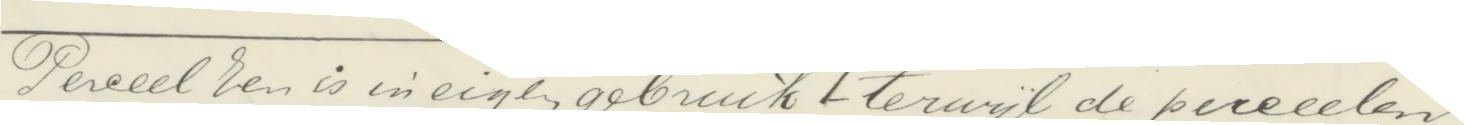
Perceel Een is in eigen gebruikt terwijl de perceelen
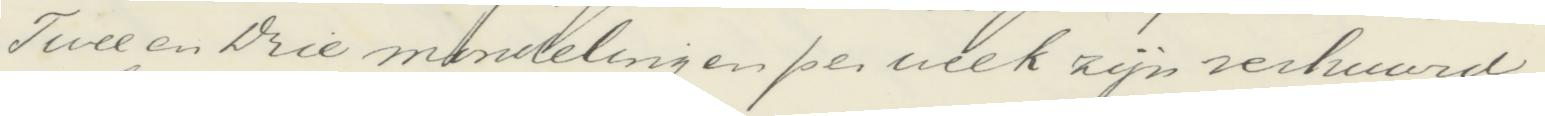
Twee en Drie mondeling en per week zijn verhuurd
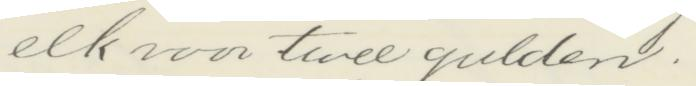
elk voor twee gulden.
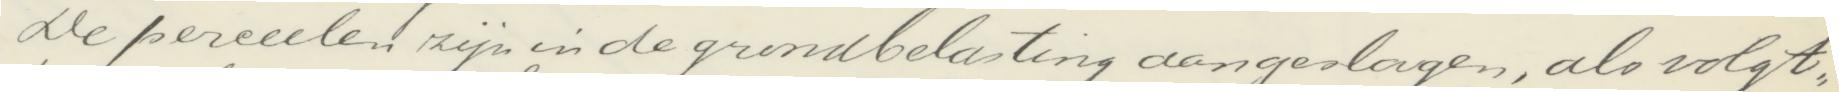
De perceelen zijn in de grondbelasting aangeslagen, als volgt,
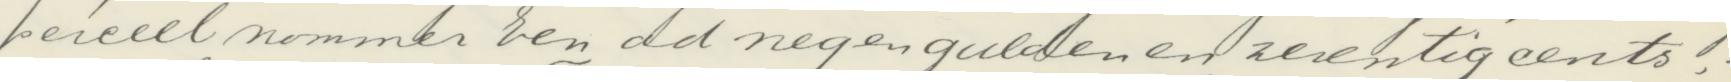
perceel nommer Een ad negen gulden en zeventig cents.
